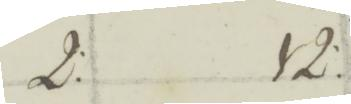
2: 12:
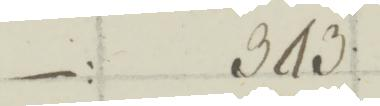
—: 343:
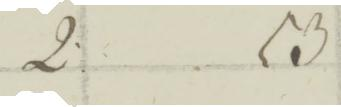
2: 53
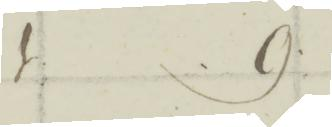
1: 9:
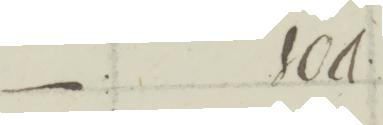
—: 104
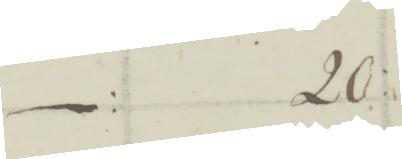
—: 20
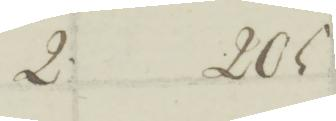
2: 205
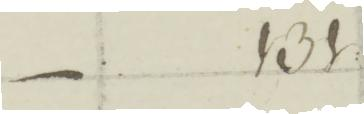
—: 131
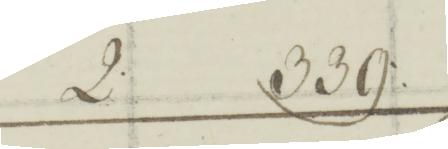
2: 339:
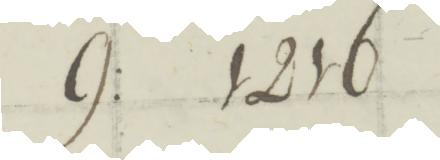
9: 1216
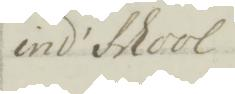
in d’ school
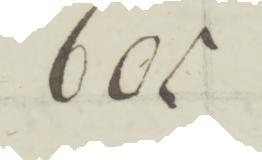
605
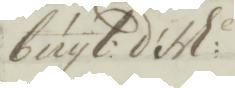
buijt: d’sch:e
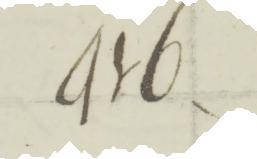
416
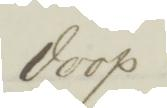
doop
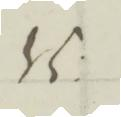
15:
